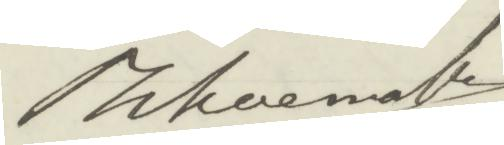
PSchoemaker
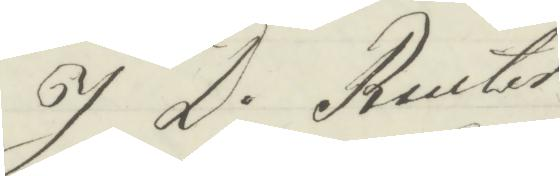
J D. Ruiter
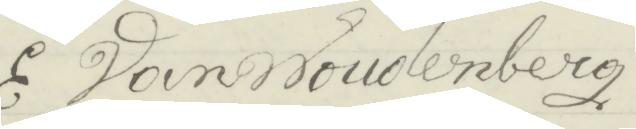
E Van Woudenberg
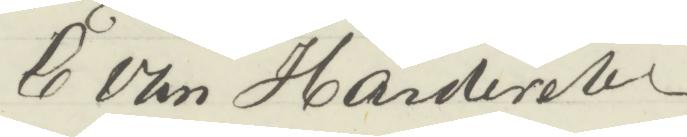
C van Hardeveld
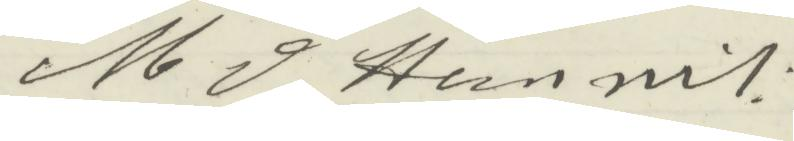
M v Hunnik:
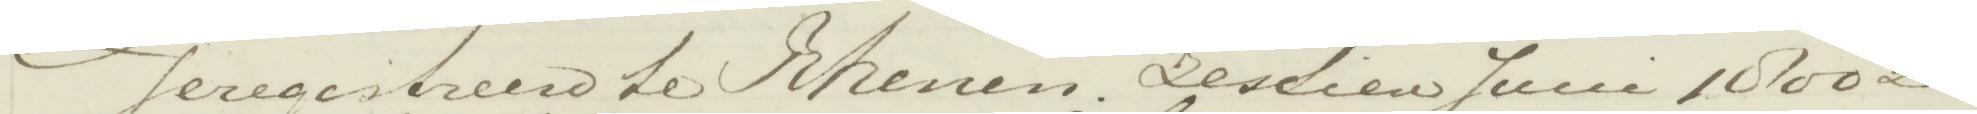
Geregistreerd te Rhenen. Zestien Juni 1800 ze
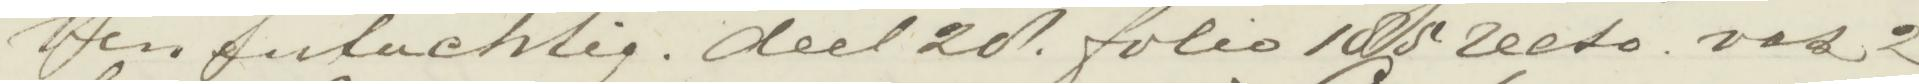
ven entachtig. deel 28. folio 185 recto. vak 2
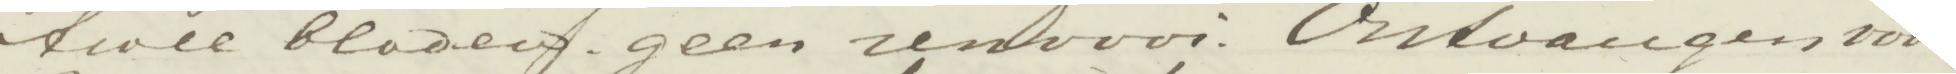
twee bladen. geen renvooi. Ontvangen voor
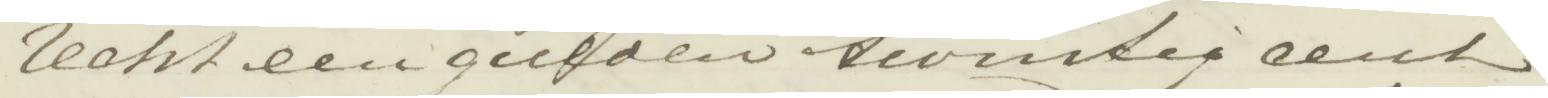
recht een gulden twintig cent
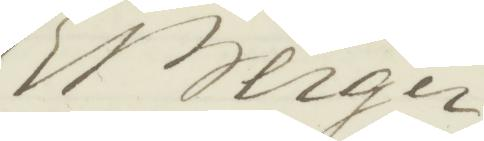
RBerger
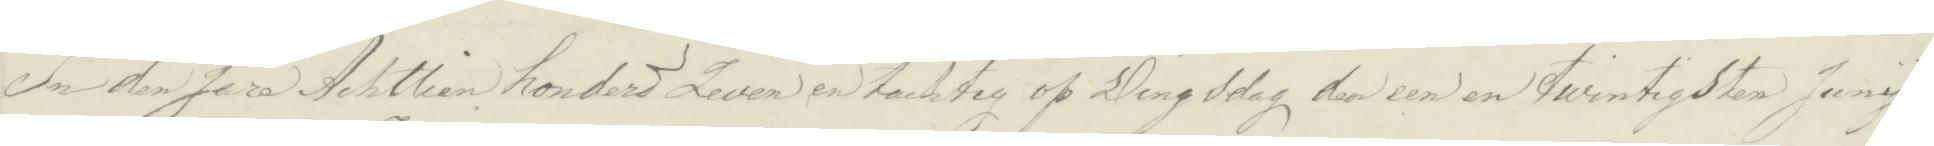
In den Jare Achttien honderd Zeven en tachtig op Dingsdag den een en twintigsten Junij
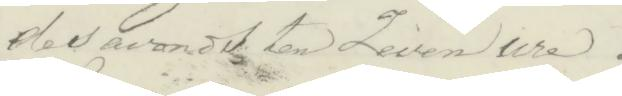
des avonds ten Zeven ure
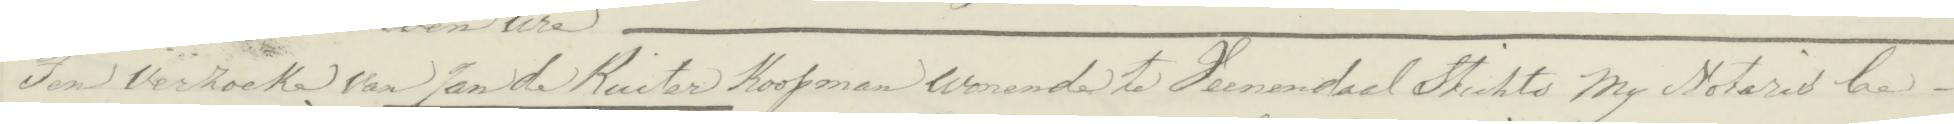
Ten verzoeke van Jan de Ruiter koopman wonende te Veenendaal Stichts my Notaris be
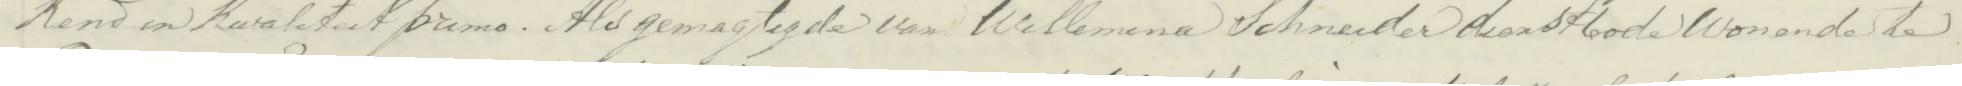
kend in kwaliteit primo. Als gemagtigde van Willemina Schneider dienstbode wonende te
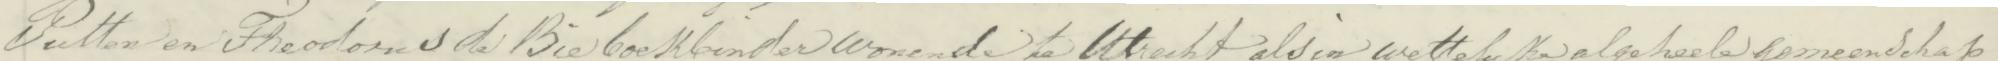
Putten en Theodorus de Bie boekbinder wonende te Utrecht als in wettelyke algeheele gemeenschap
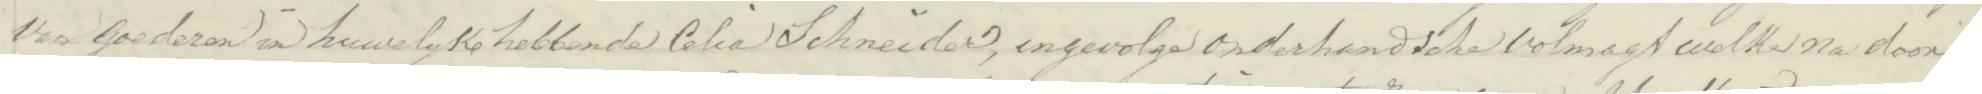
van goederen in huwelyk hebbende Celia Schneider, ingevolge onderhandsche volmagt welke na door
